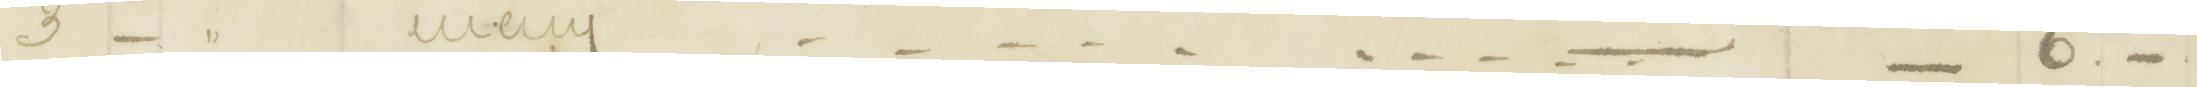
3 - „ menij - - - - - - - - - —:' — 6. —
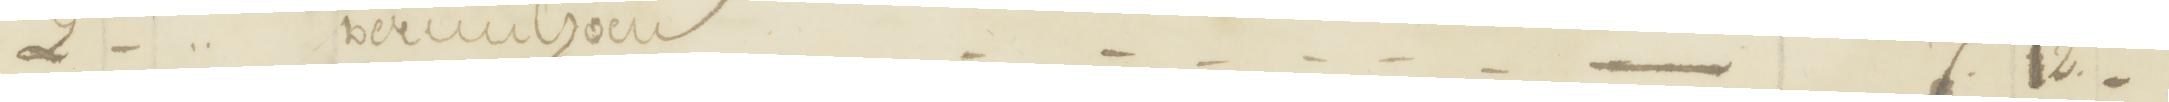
2 - „ vermiljoen - - - - - —:' 7. 12. —
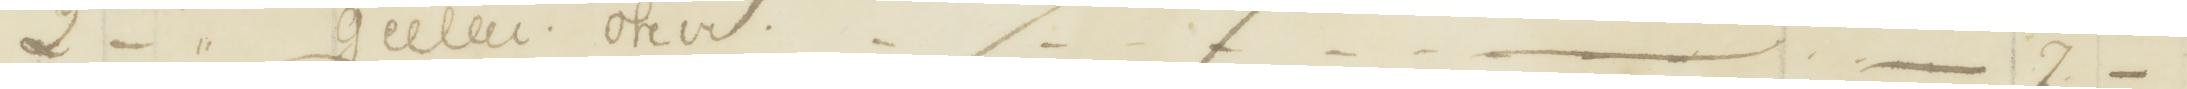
2 -„ geelen oker - - - - - - - -—:' — 7 —
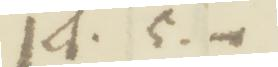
14. 5. —
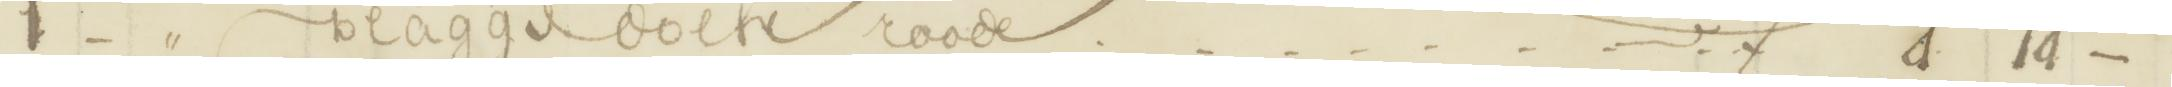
1 - „ vlagge doek roode- - - - - - - —: ' ƒ 4 14 —
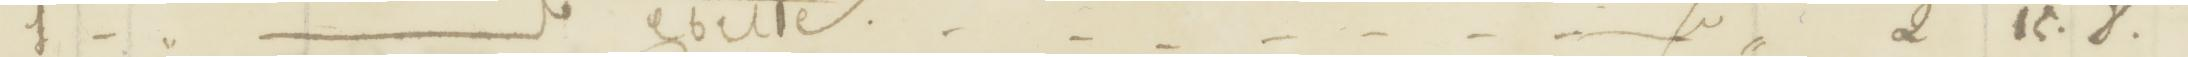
1 - „—:o witte- - - - - - - -—:o „ 2 15. 8.
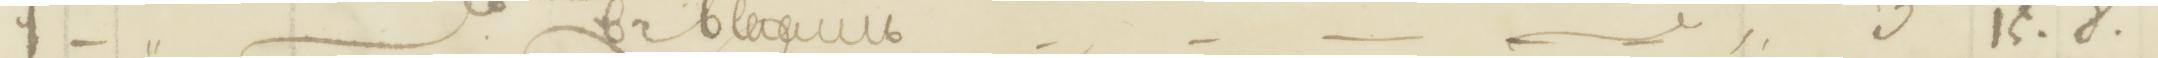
1 - „ —: o br blaauw- - - - —:o „ 3 15. 8.
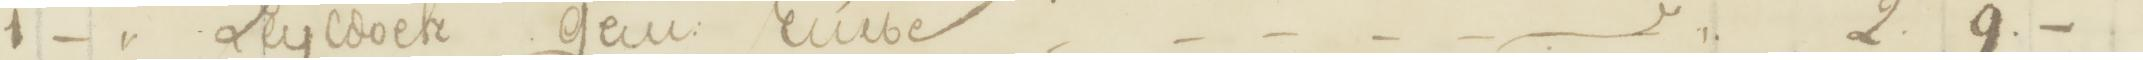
1 - „ Zeijldoek gem: ruwe - - - - - —:o „ 2. 9. —
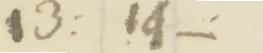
13: 14 —
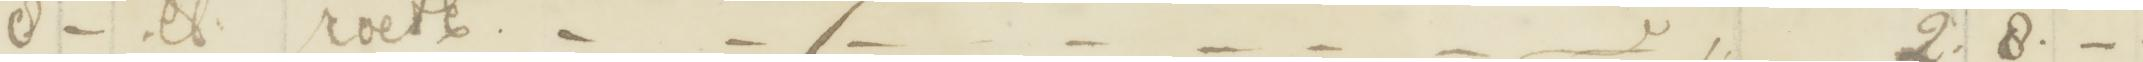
8 - lb roeth - - - - - - - —:o „ 2. 8. —.
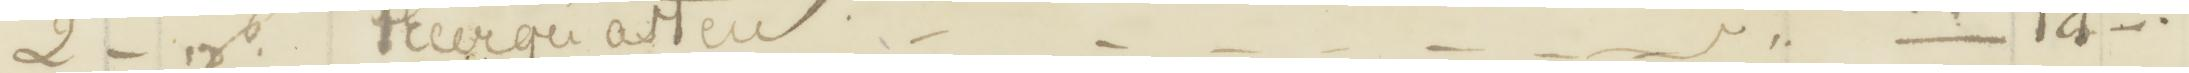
2- p:s theerquasten - - - - - - —:o „ — 14 —.
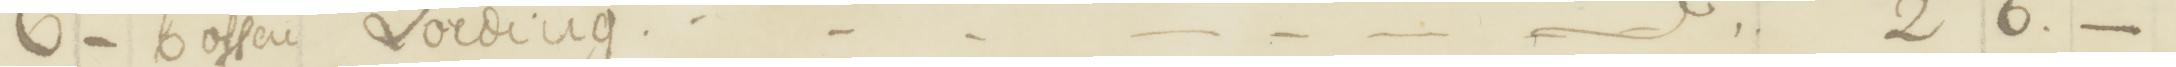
6 - bossen Lording - - - - - - —:o „ 2 6. —
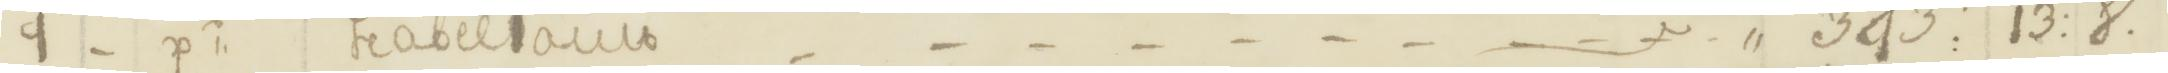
4 - p„s kabeltouw- - - - - - - - - —:o „ 343: 13: 8.
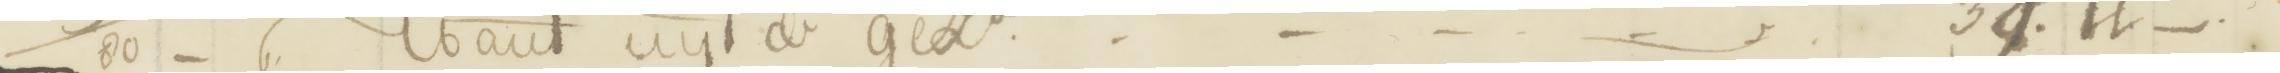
— 19/80 - „ want uijt de gez:d - - - - —:' „ 39. 11. —.
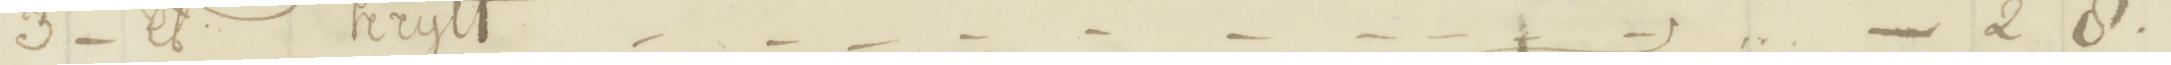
3 - lb krytt - - - - - - - - - —:' „ — 2 8.
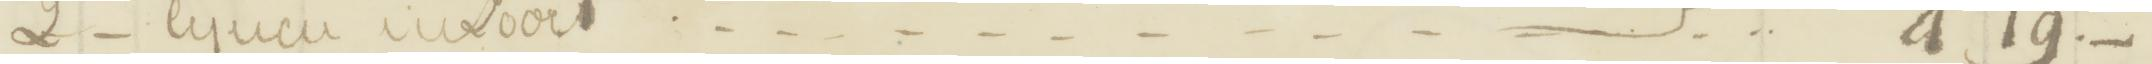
2 - lynen in Zoort - - - - - - - - - - —:' „ 4 19. —
